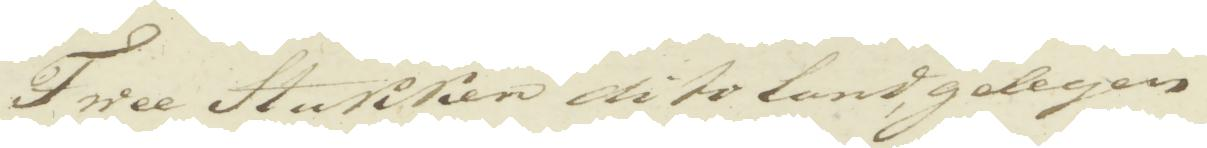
Twee stukken dito land, gelegen
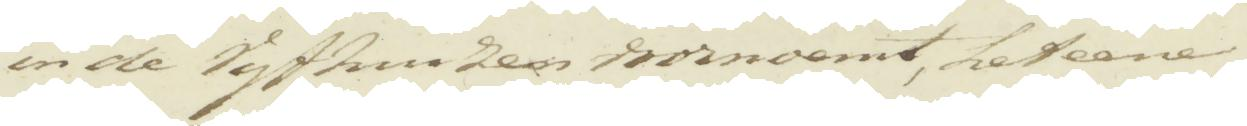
in de Vyfhuizen voornoemt, het eene
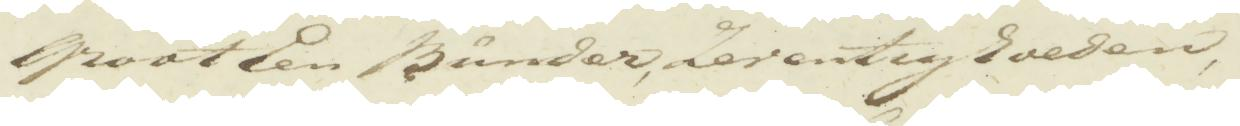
Groot Een Bunder, Zeventig Roeden,
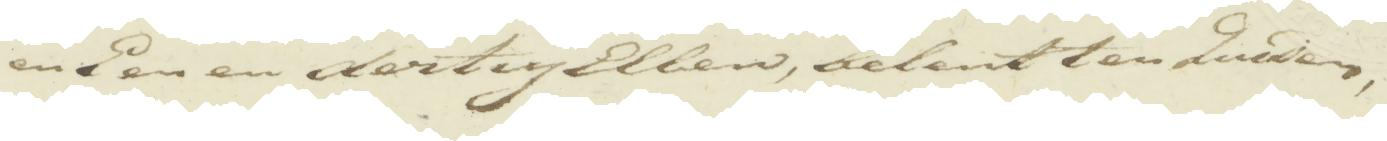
en Een en dertig Ellen, belent ten Zuiden,
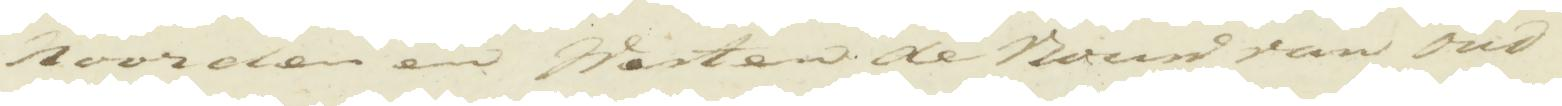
Noorden en Westen de Vrouw van Oud
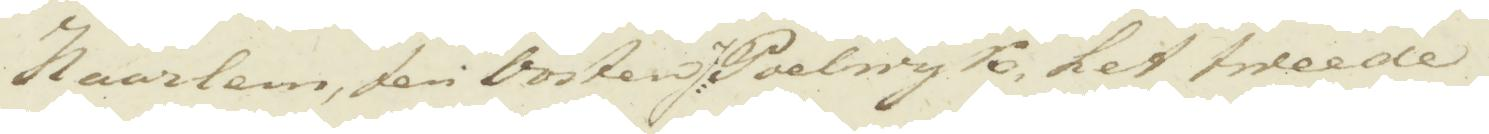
Haarlem, ten Oosten J: Poelwyk, het tweede
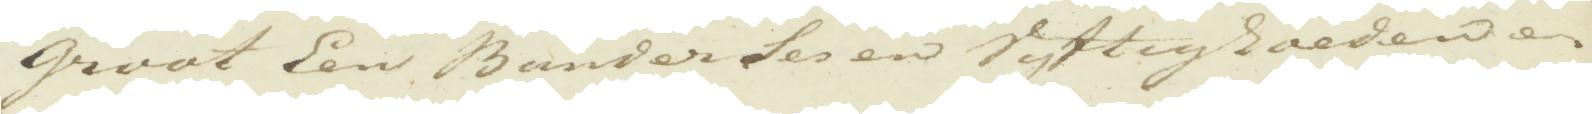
Groot Een Bunder en Ses en Vyftig Roeden en
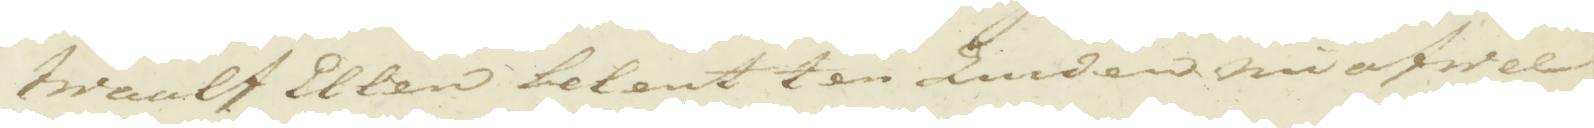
twaalf Ellen belent ten Zuiden nu ofwel
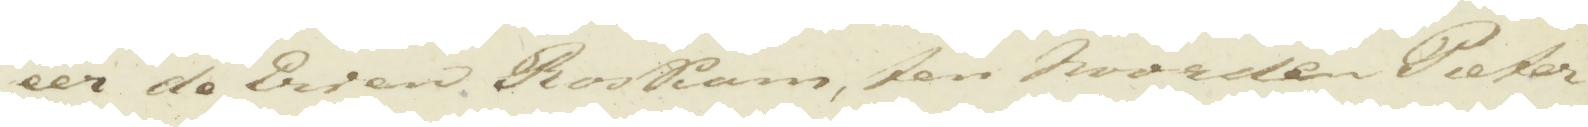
eer de Erven Roskam, ten Noorden Pieter
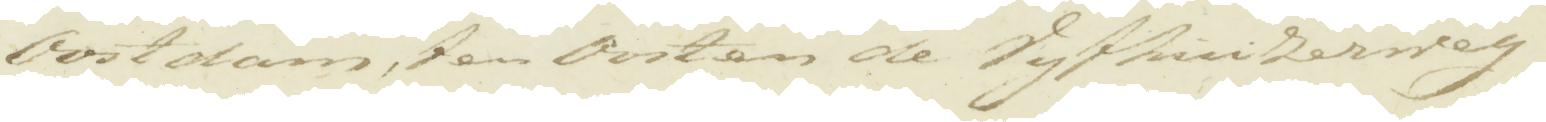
Oostdam, ten Oosten de Vyfhuizer weg
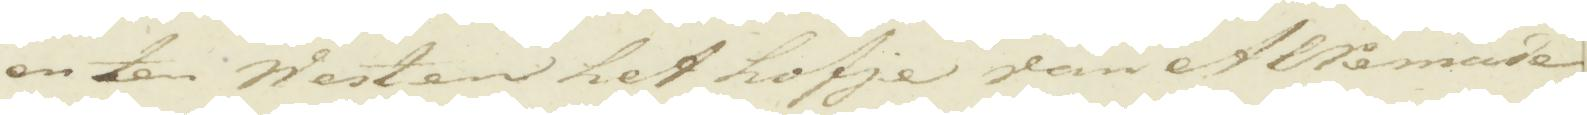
en ten Westen het hofje van Alkemade
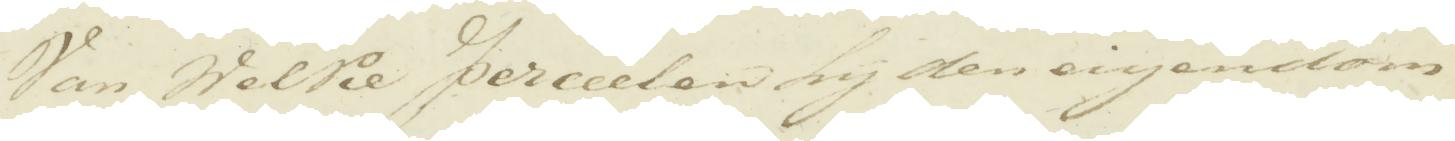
Van welke Perceelen hij den eigendom
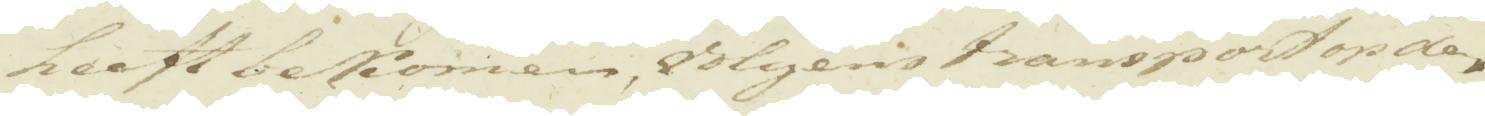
heeft bekomen, volgens transport op den
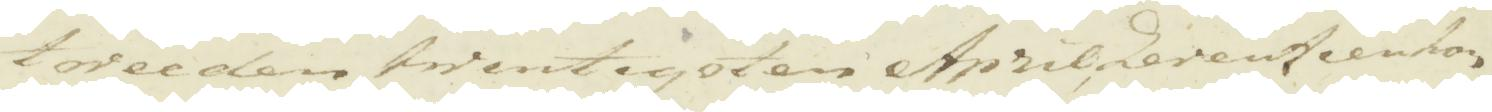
tweeden twintigsten April, Zeventien hon
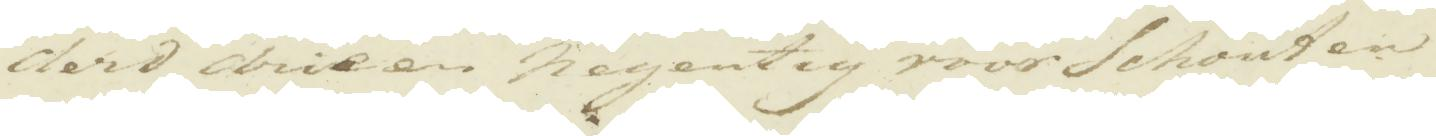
derd drie en Negentig voor Schout en
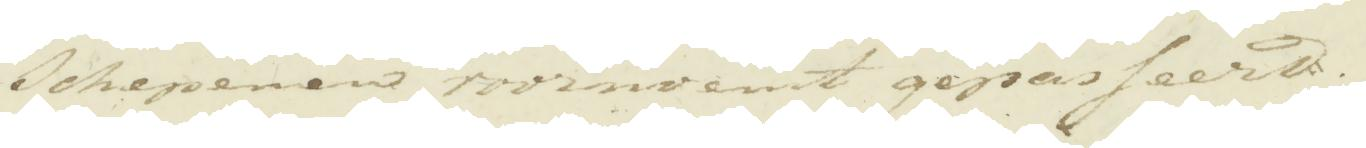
schepenen voornoemt gepasseerd.
